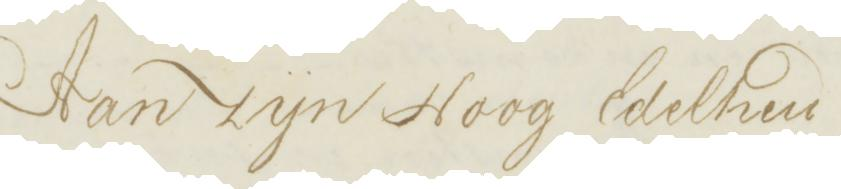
Aan zijn Hoog Edelhen
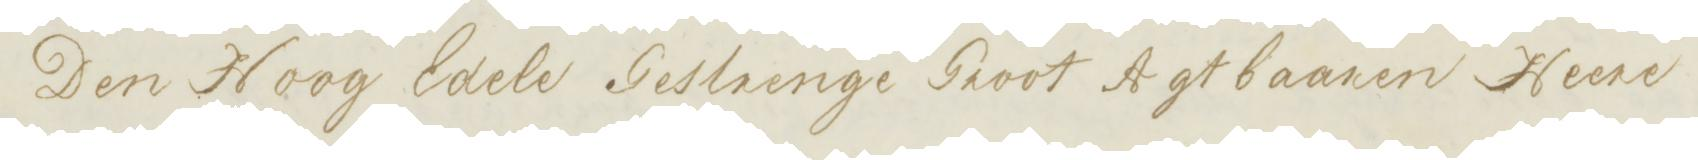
Den Hoog Edele Gestrenge Groot Agtbaaren Heere
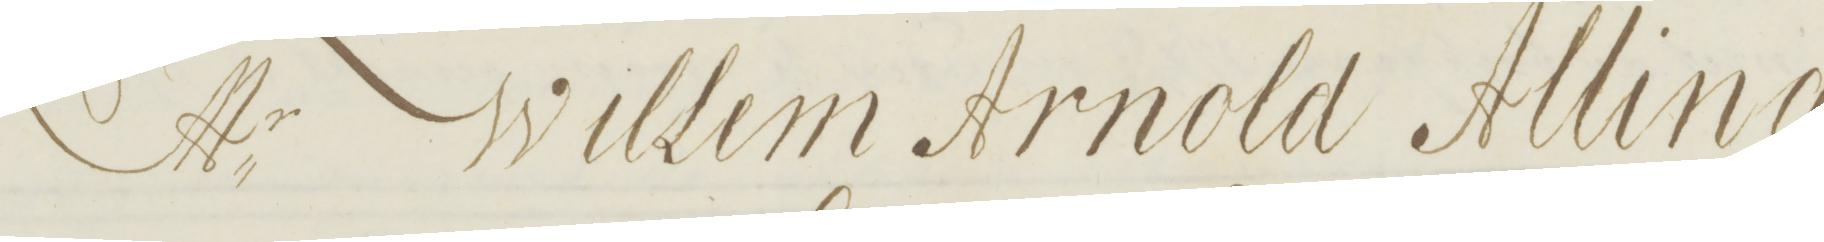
M„r Willem Arnold Alling
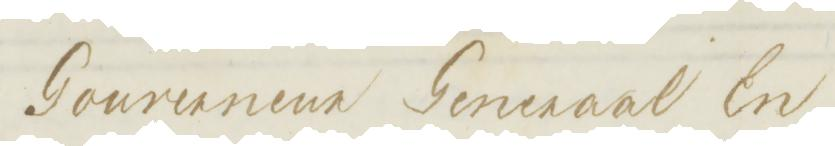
Gouverneur Generaal En
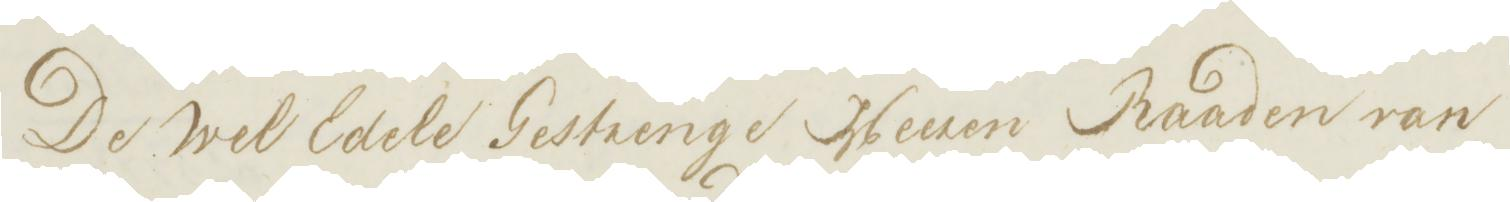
De Wel Edele Gestrenge Heeren Raaden van
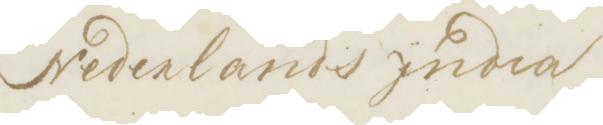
Nederlands jndia
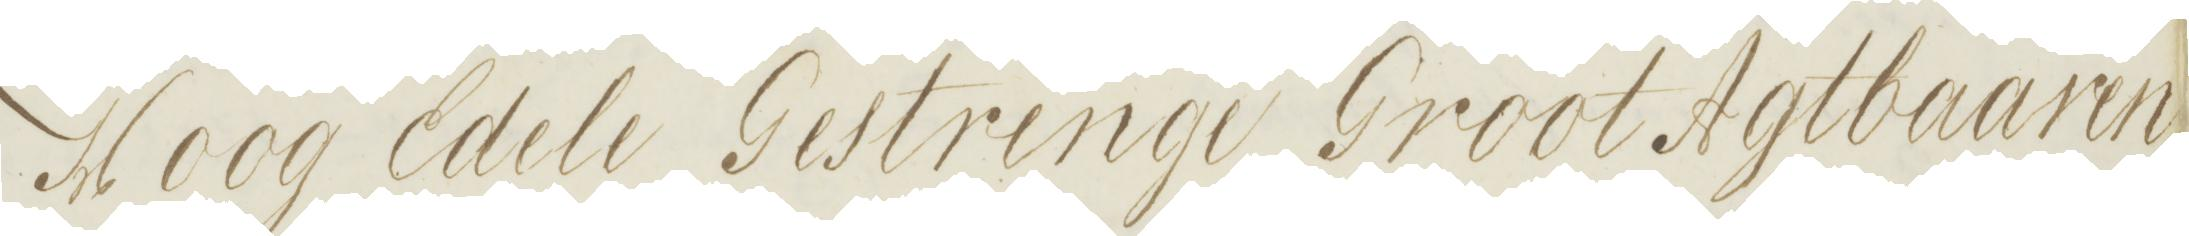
Hoog Edele Gestrenge Groot Agtbaaren
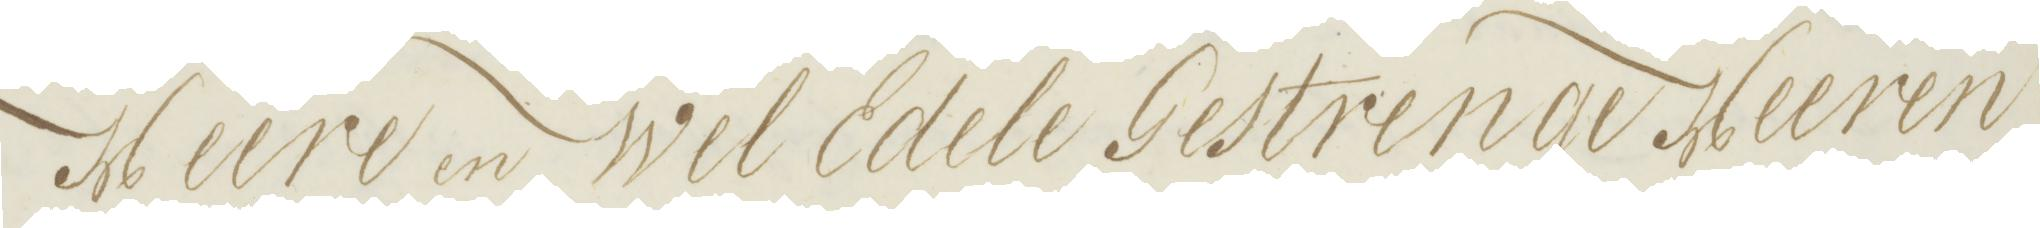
Heere en Wel Edele Gestrenge Heeren
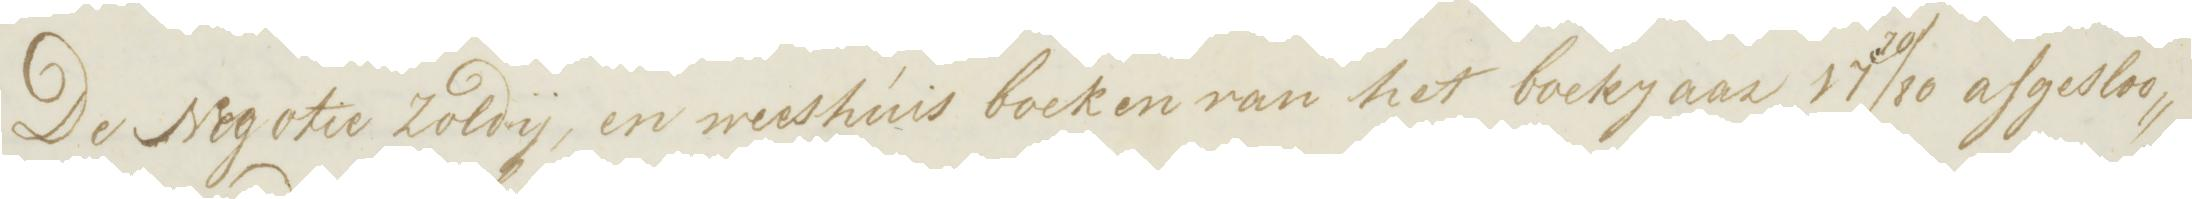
De Negotie zoldij, en weeshuis boeken van het boekjaar 1770/80 afgesloo„
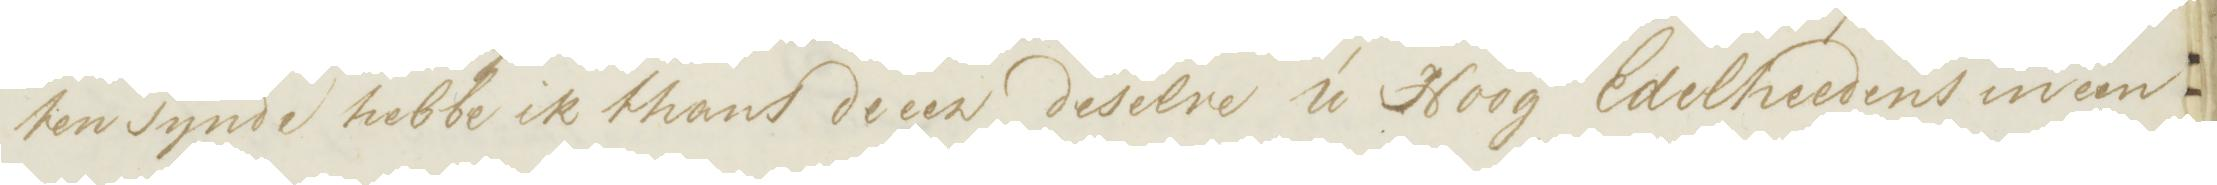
ten synde hebbe ik thans de eer deselve u Hoog Edelheedens in een
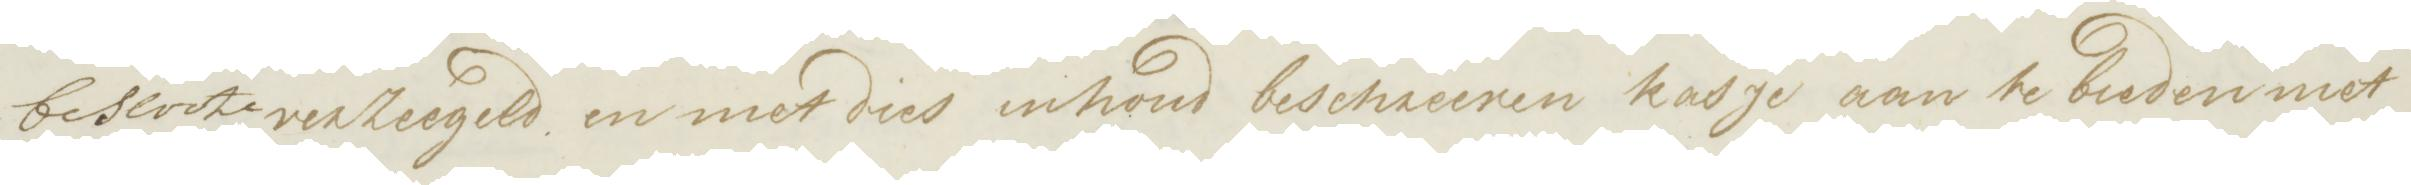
besloote verzeegeld, en met dies inhoud beschreeven kasje aan te bieden met
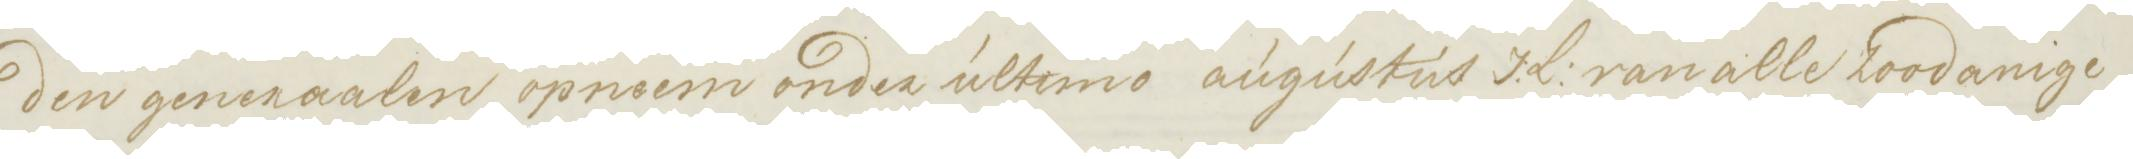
den generaalen opneem onder ultimo augustus I:L: van alle zoodanige
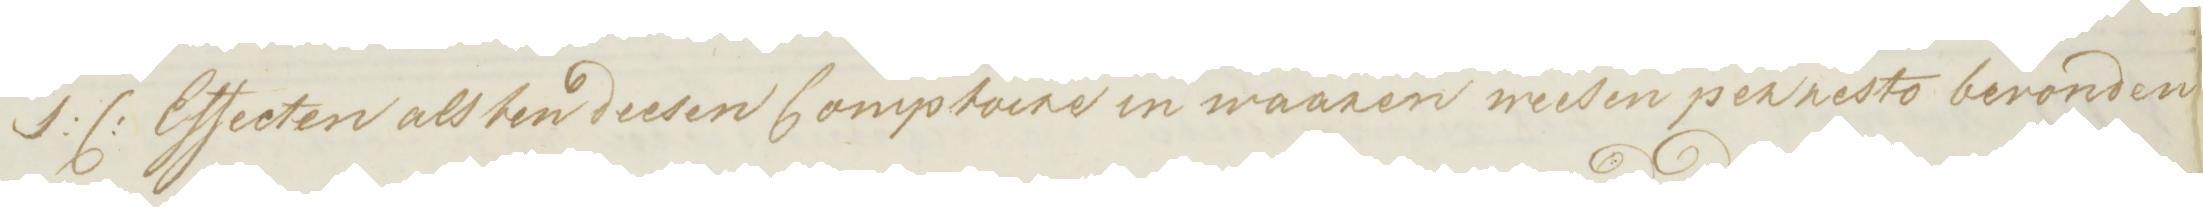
S: C: Effecten als ten deesen Comptoire in waaren weesen per resto bevonden
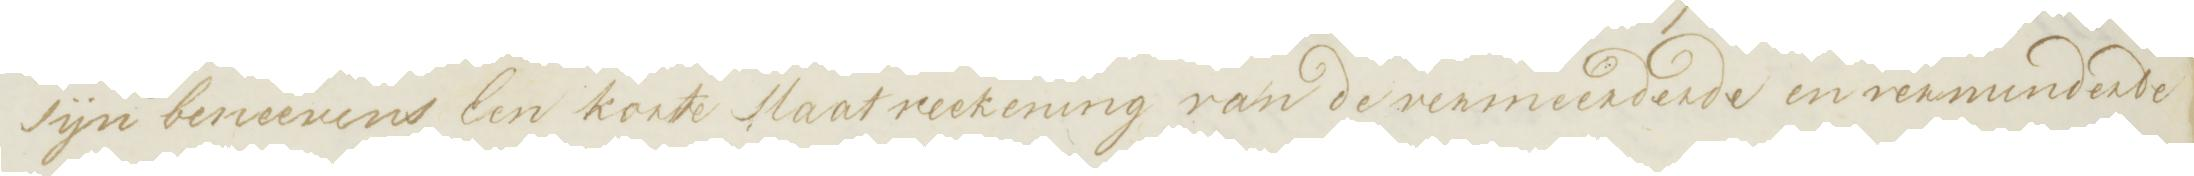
sijn beneevens Een korte slaatreekening van de vermeerderde en verminderde
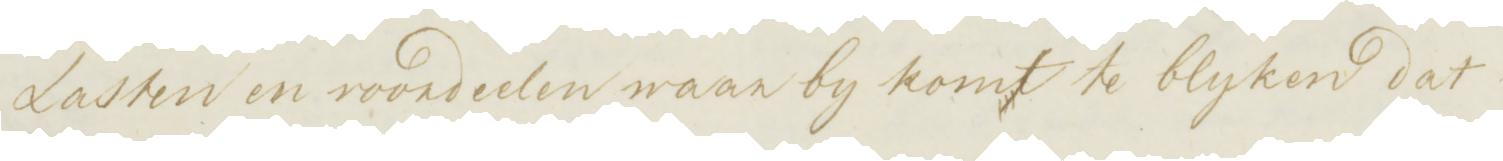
Lasten en voordeelen waar by komt te blijken dat
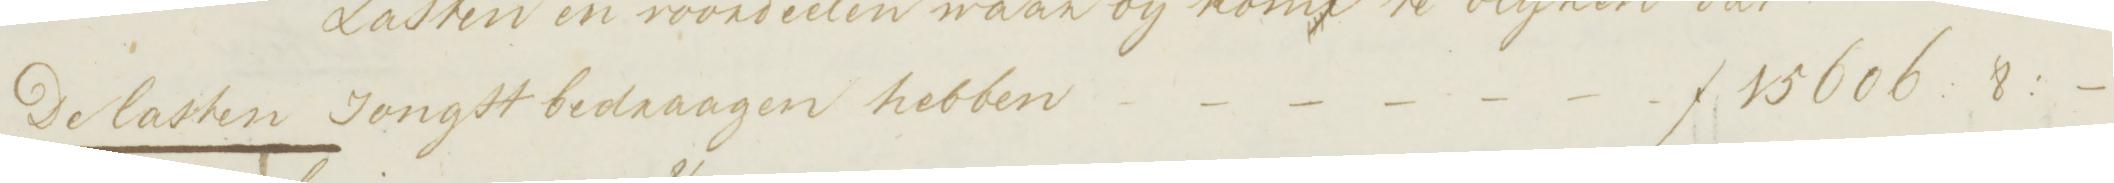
De lasten iongst bedraagen hebben - - - - - - - ƒ 15606: 8: —
